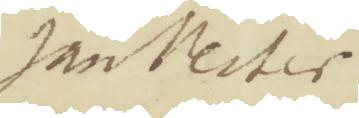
Jan Vester
